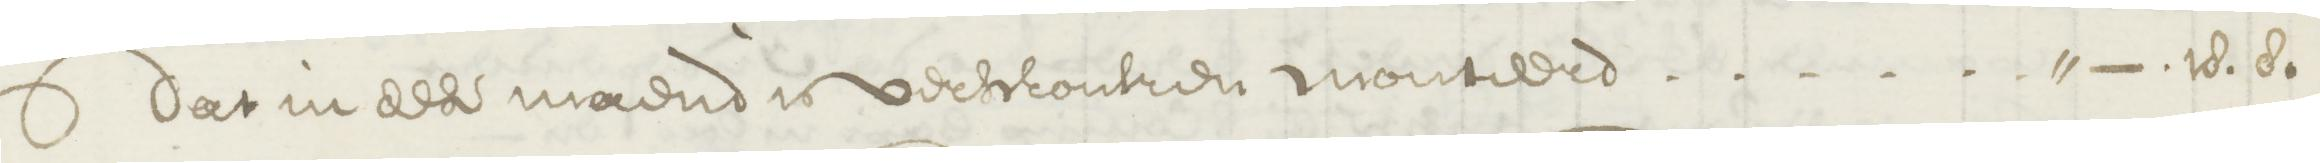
dat in dese maend is verschonken monteerd - - - - - - „ —.18. 8.
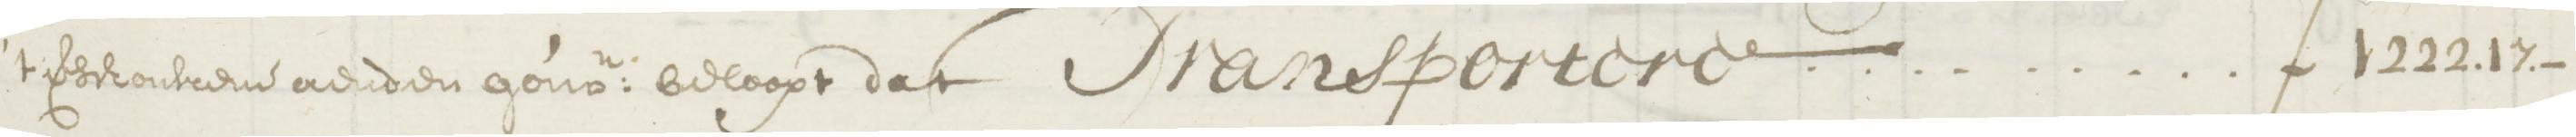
’t verschonkene aenden gouv: beloopt dat Transportere - - - - - - - - - - ƒ 1222.17.-
